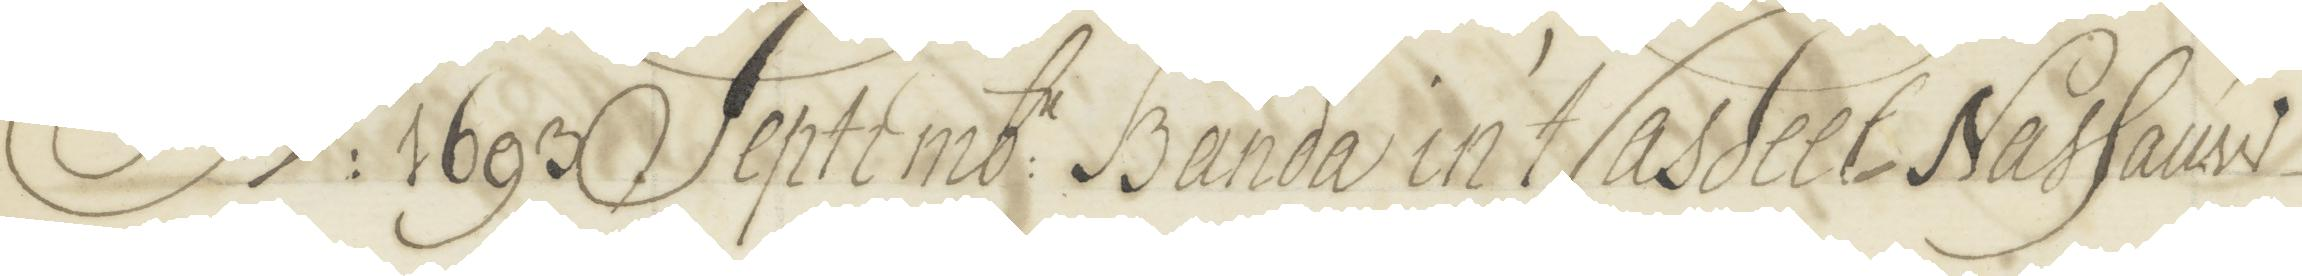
A:o 1693 Septemb:r Banda in’t Casteel Nassauw
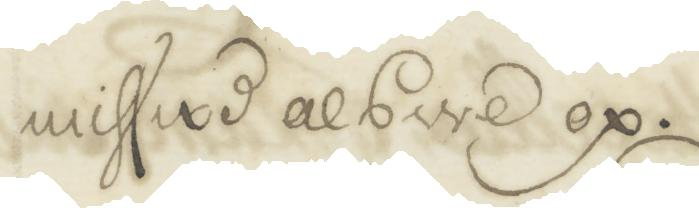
missive als we op.
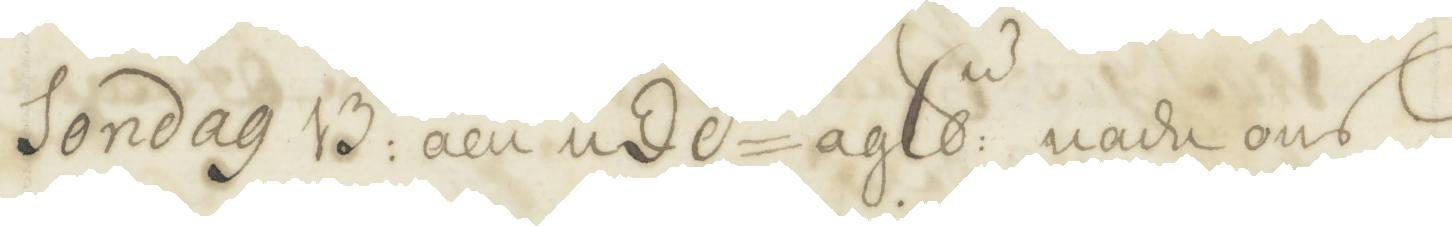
Sondag 13:en aen uEd=le agtb:re naer ons
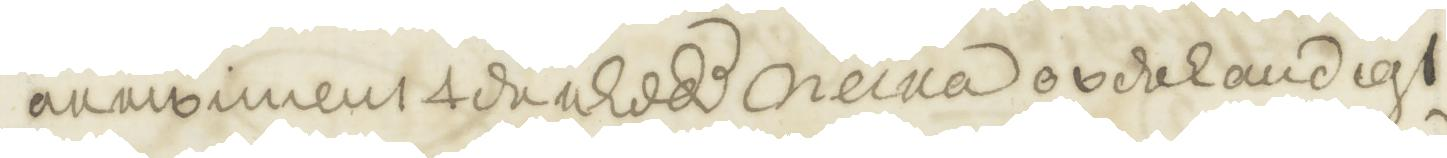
arriviment ter rhede neira overhandigt
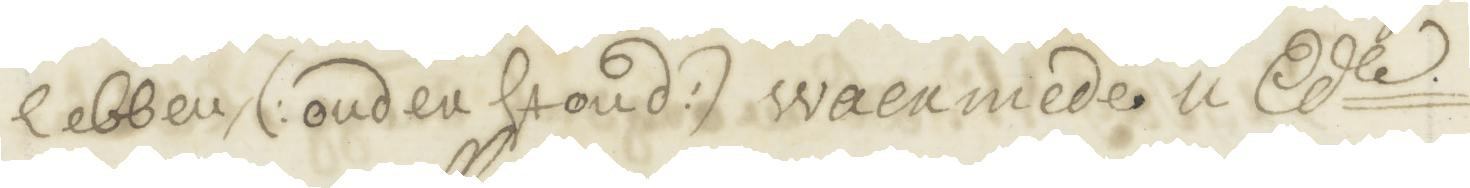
hebben, (:onderstond:) waermede u Ed=le.
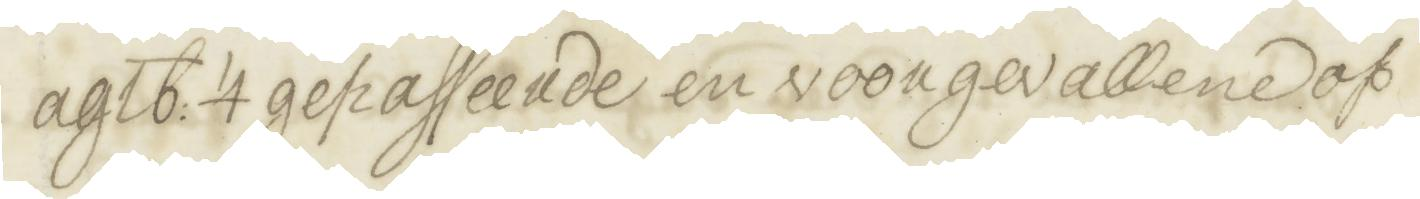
agtb: ’t gepasseerde en voorgevallene op
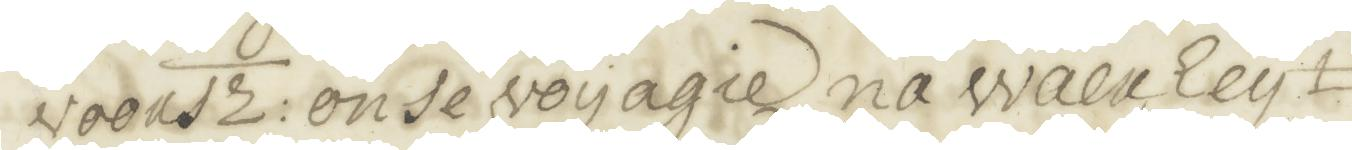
voorsz: onse voijagie na waerheijt
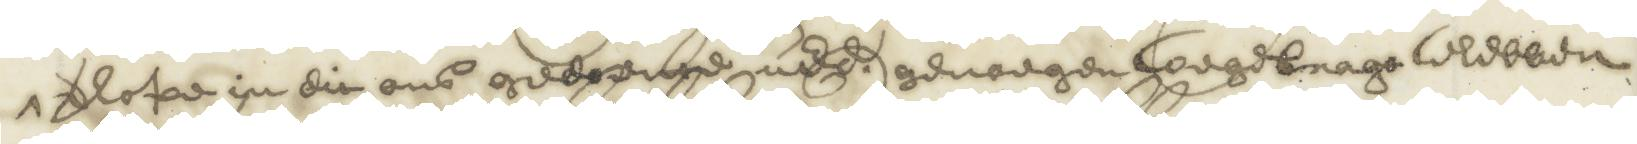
^ verhoope in dit ons gedoente uEd: genoegen toegebragt tehebben
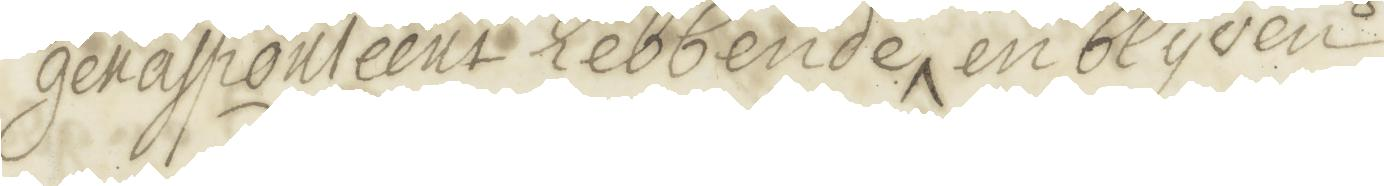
gerapporteert hebbende^ en blyven
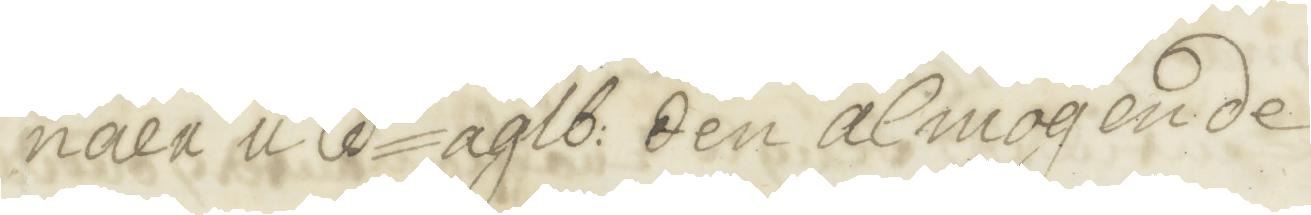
naer uEd=le agtb: den almogende
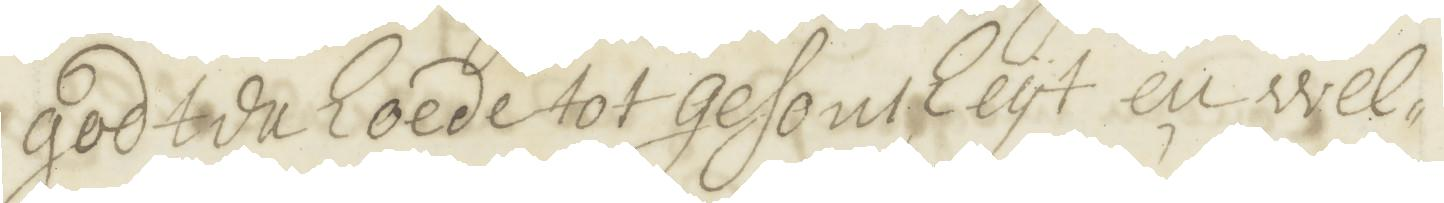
god ter hoede tot gesontheijt en wel„
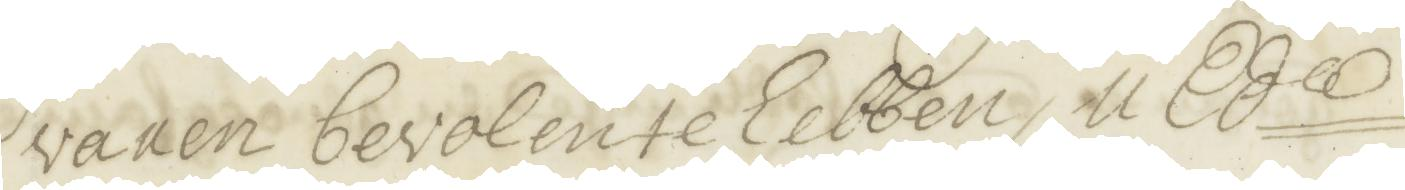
varen bevolen te hebben, uEd=le
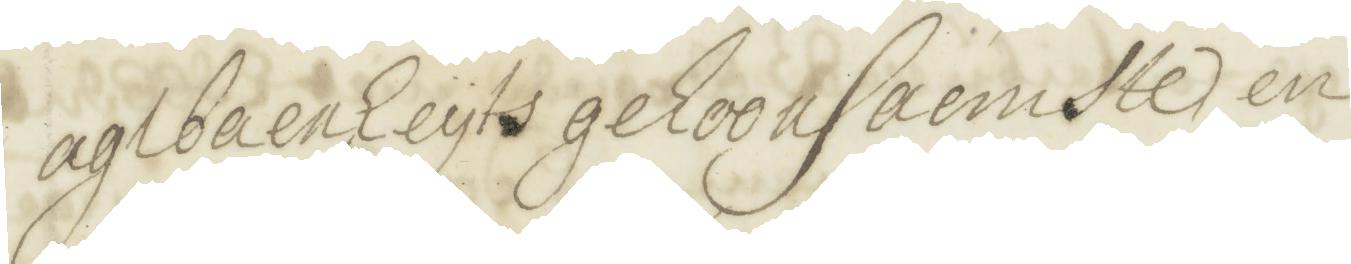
agtbaerheijts gehoorsaemste en
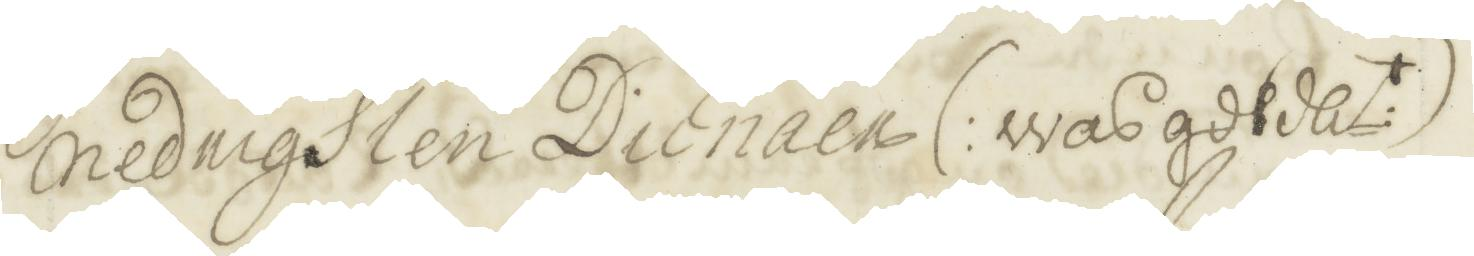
nedrigsten Dienaer (:was getek=t:)
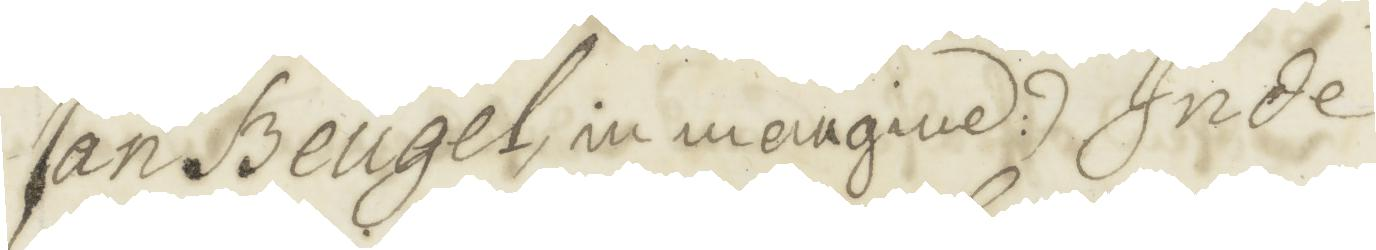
Jan Beugel, in margine:) Jn de
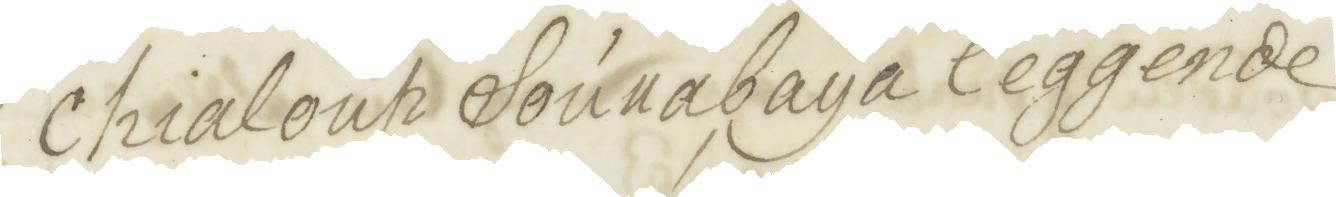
chialoup sourabaija leggende
